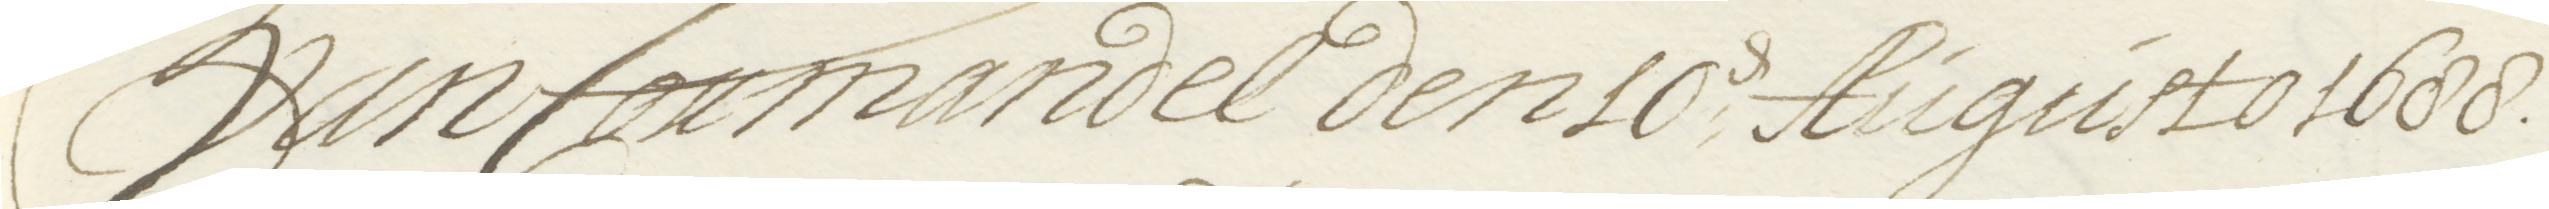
Van Cormandel den 10„e Augusto 1688.
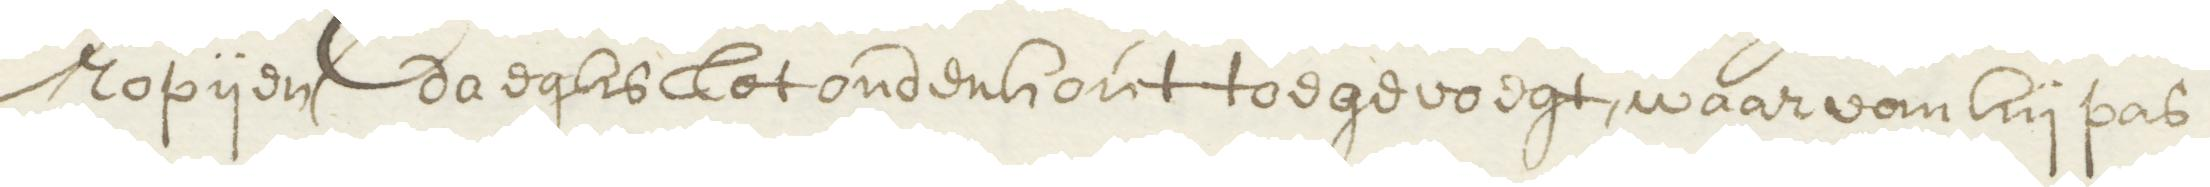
ropijen daeghs Tot onderhout toegevoegt, waar van hij pas
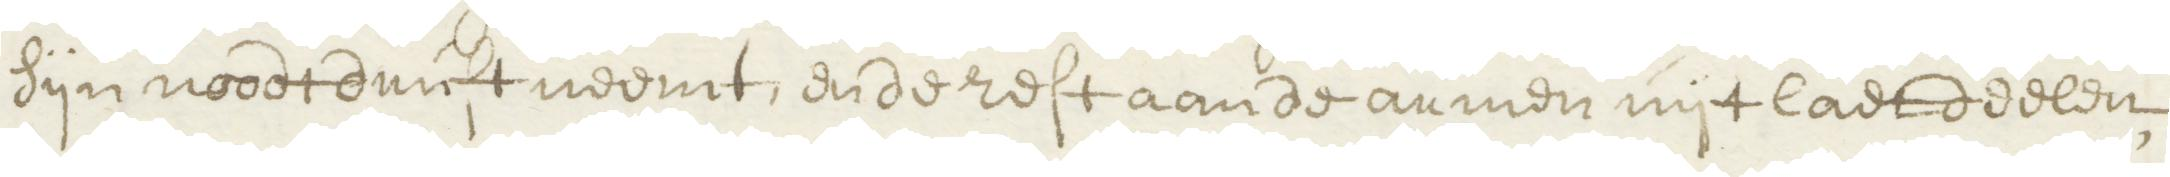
sijn noodt druft neemt, en de rest aan de armen uijt laet deelen,
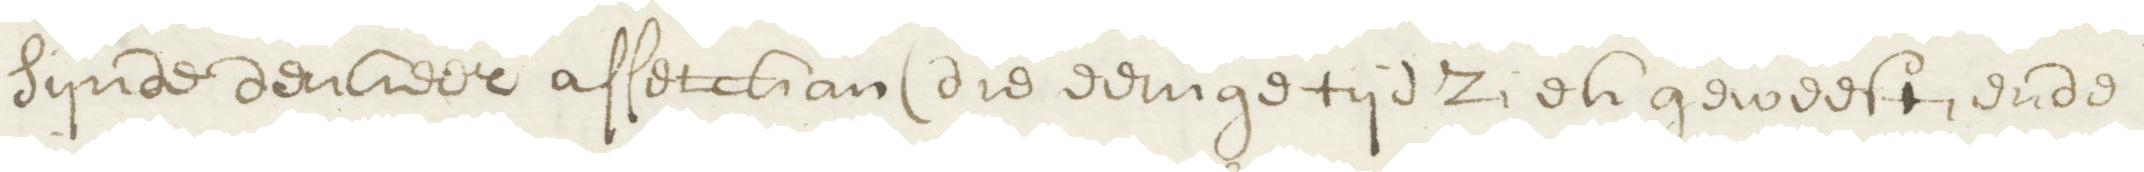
sijnde den heer assetchan (die eenige tijd ziek geweest, ende
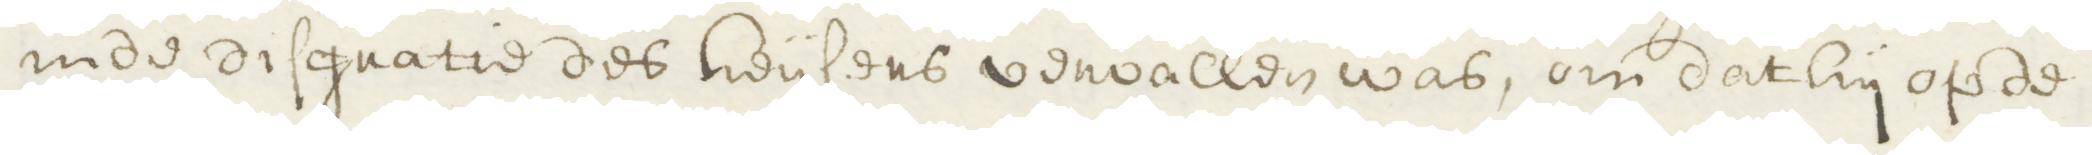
in de disgratie des keijsers vervallen was, om dat hij op de
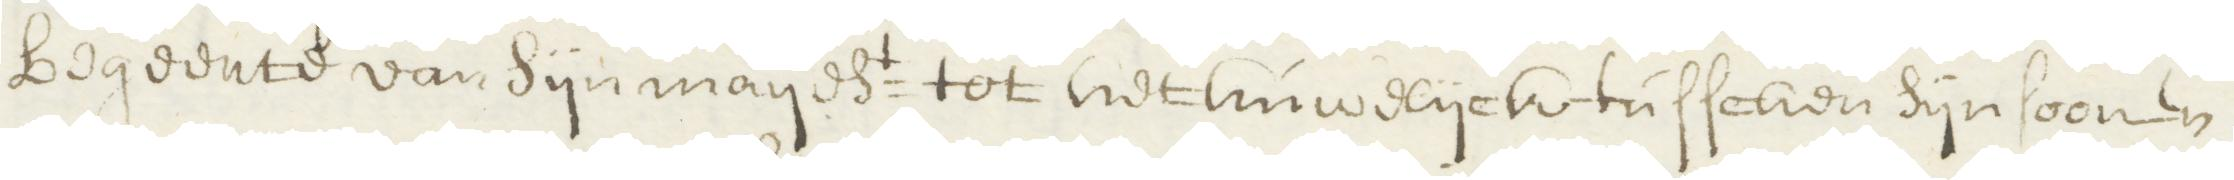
begeerte van sijn maijes=t tot het huwelijck tusschen sijn soonen
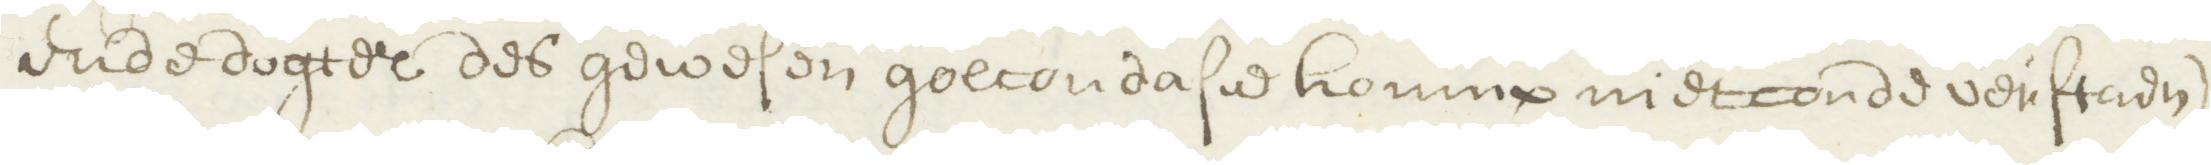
en de dogter des gewesen golcondase koninx niet conde verstaen)
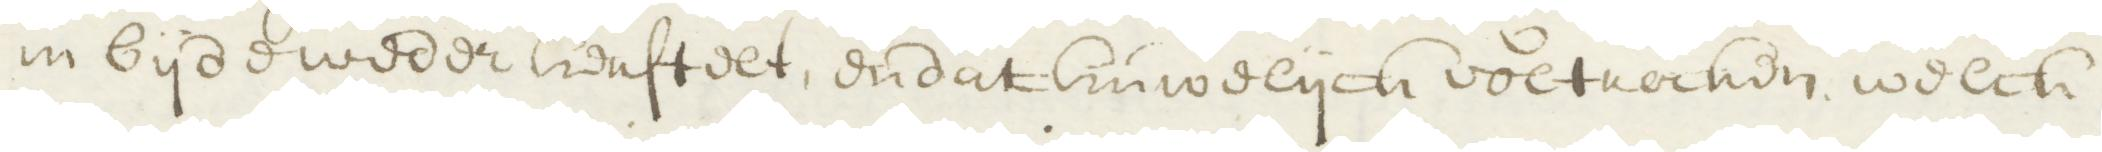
in bijde weder herstelt, en dat huwelijck voltrocken welck
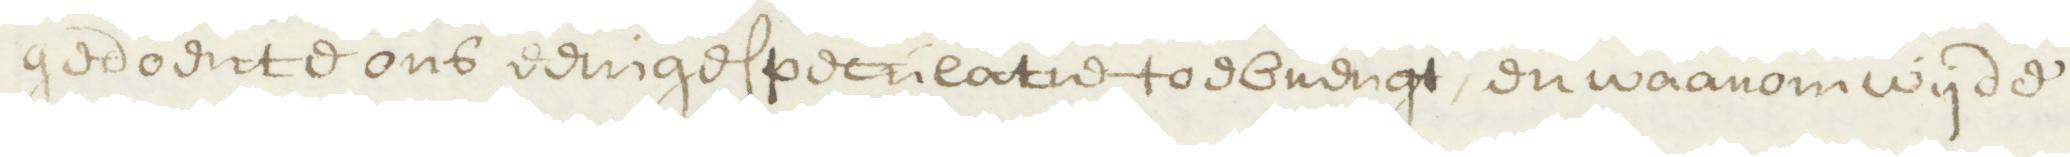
gedoente ons eenige speculatie toebrengt, en waarom wij de
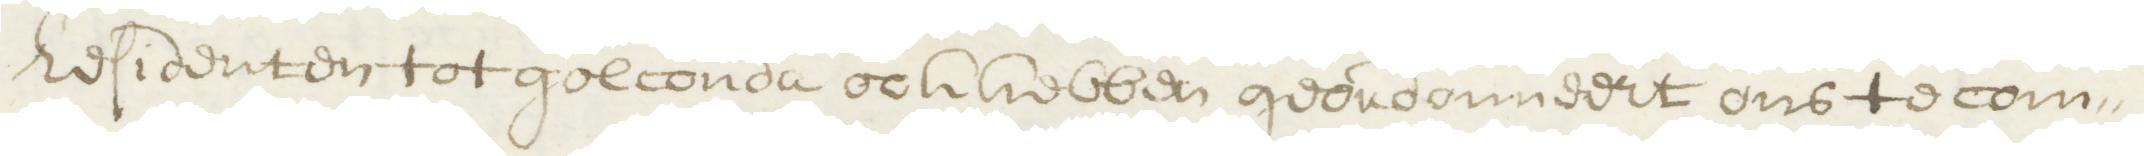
residenten tot golconda ook hebben geordonneert ons te com„
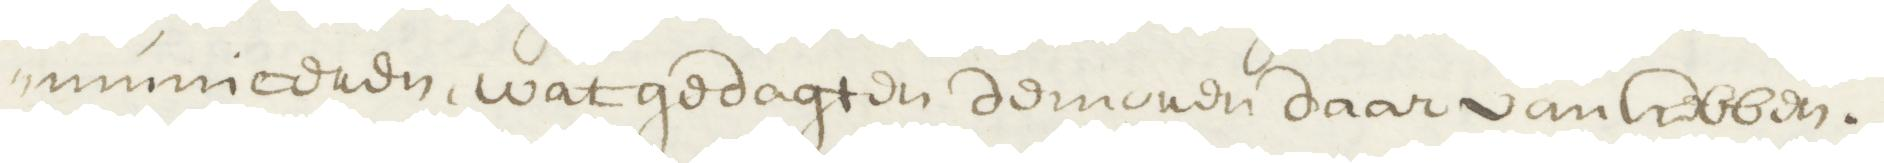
„municeren, wat gedagten de moren daar van hebben.
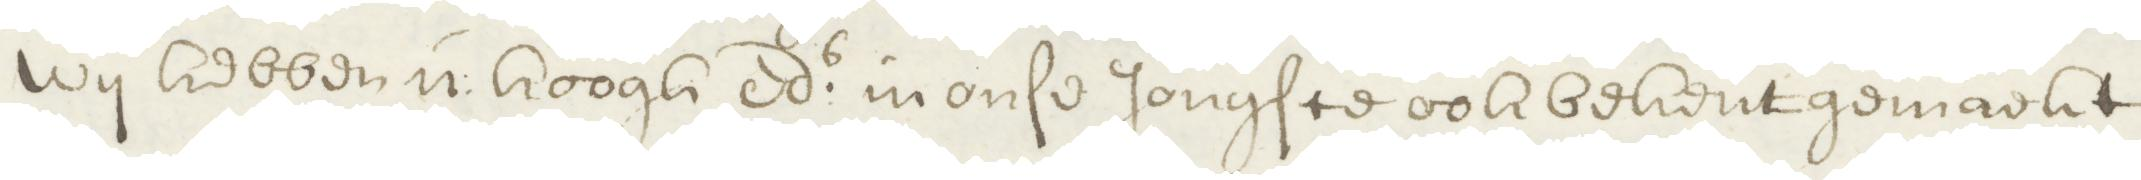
wij hebben u: hoogh Ed:s in onse Jongste ook bekent gemaekt
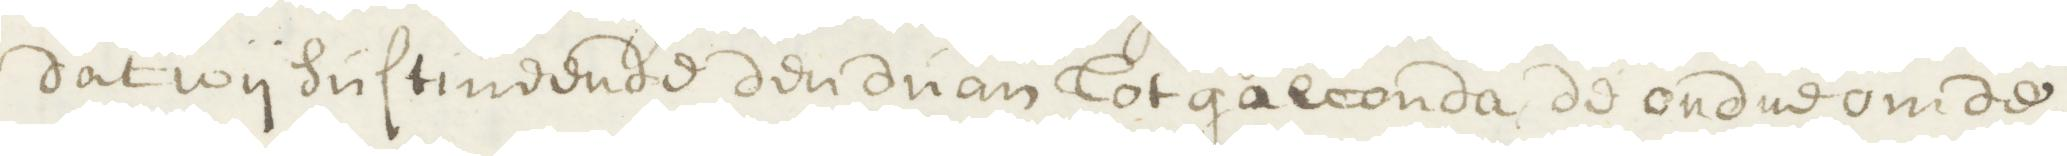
dat wij sustineerde den duan Tot galconda de ordre om de
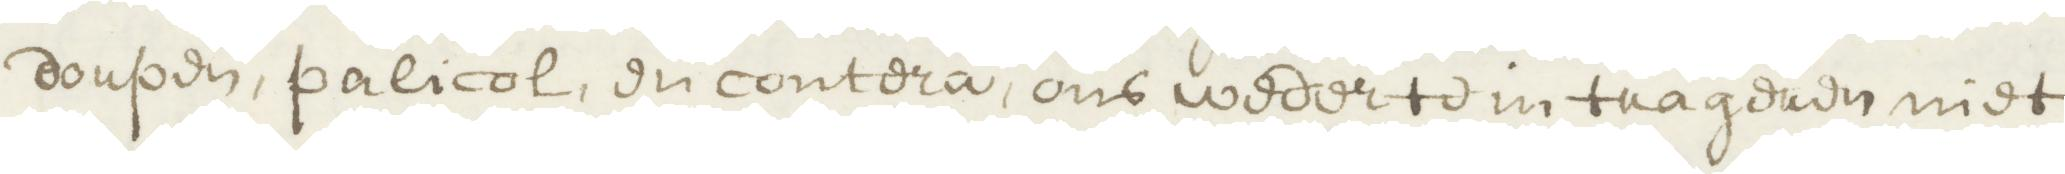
doupen, palicol, en contera, ons weder te in trageren niet
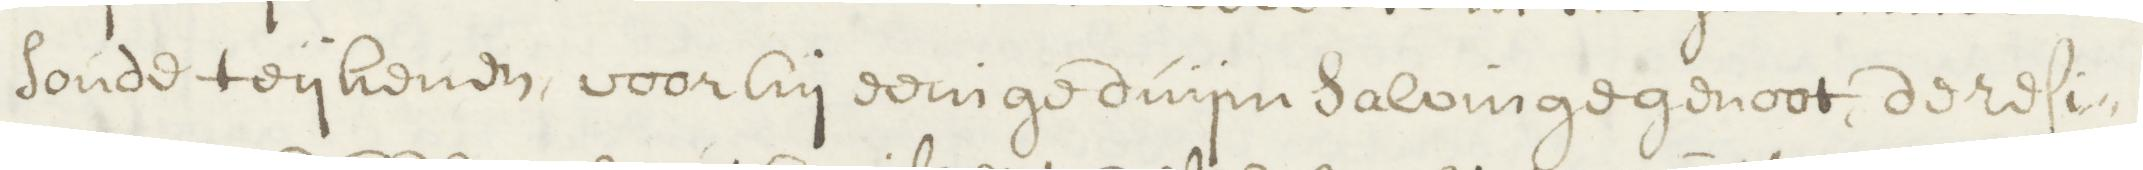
soude teijkenen, voor hij eenige duijm salvinge genoot, de resi„
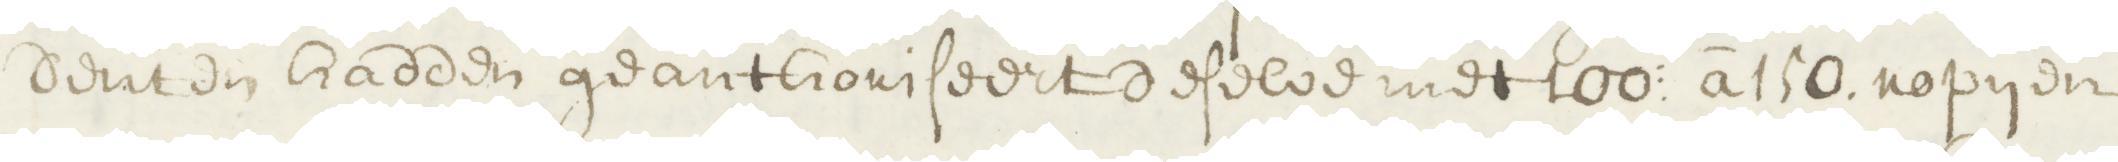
denten hadden geauthoriseert deselve met 100: â 150. ropijen
